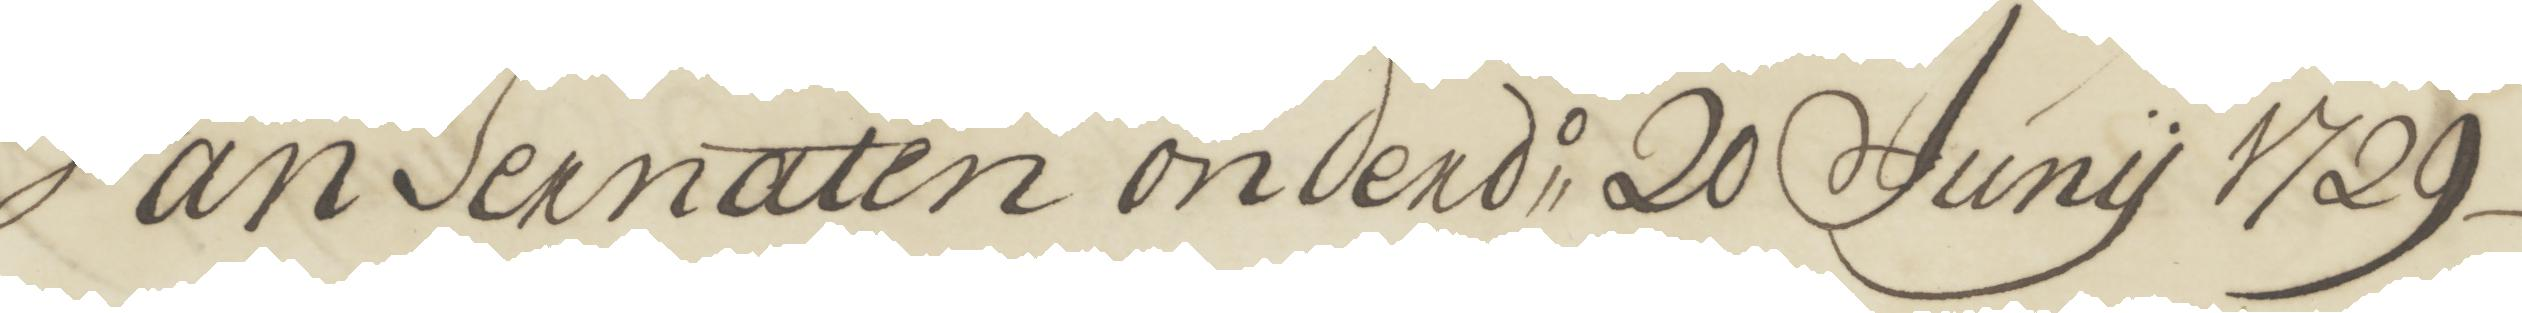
Van Ternaten onder d„o 20 Iunij 1729-
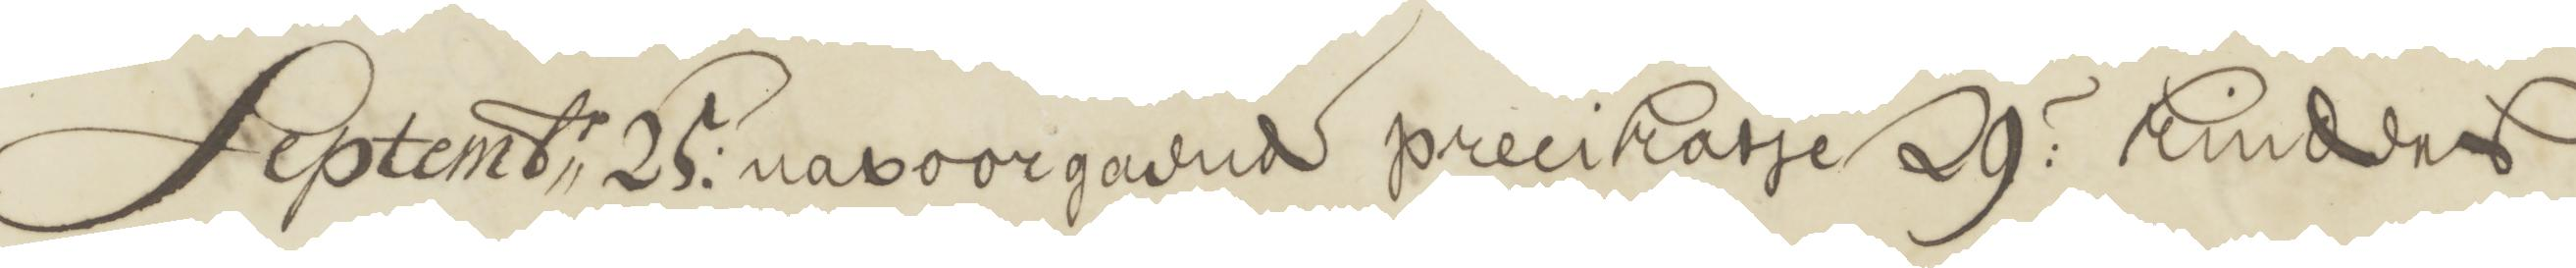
Septemb„r 25:' na voorgaende precikatje 29:' kinders
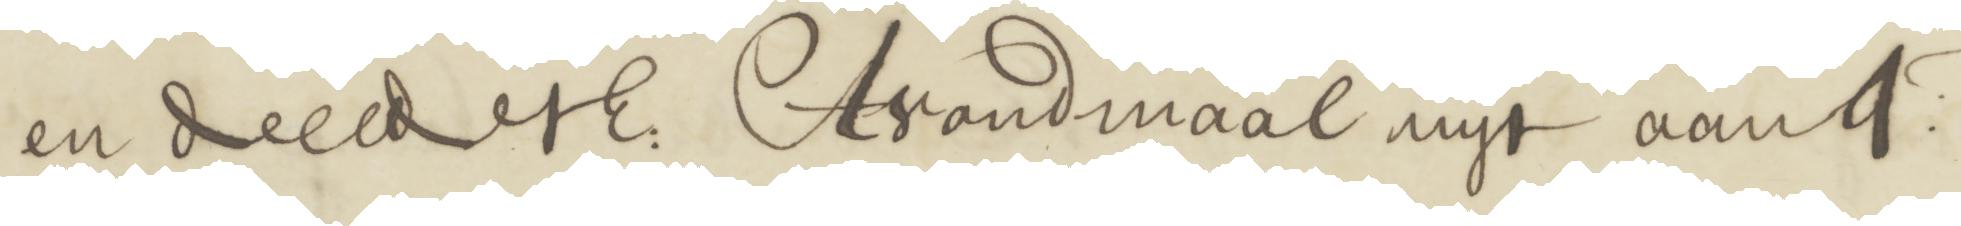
en deelde t h: Avond maal uijt aan 4:'
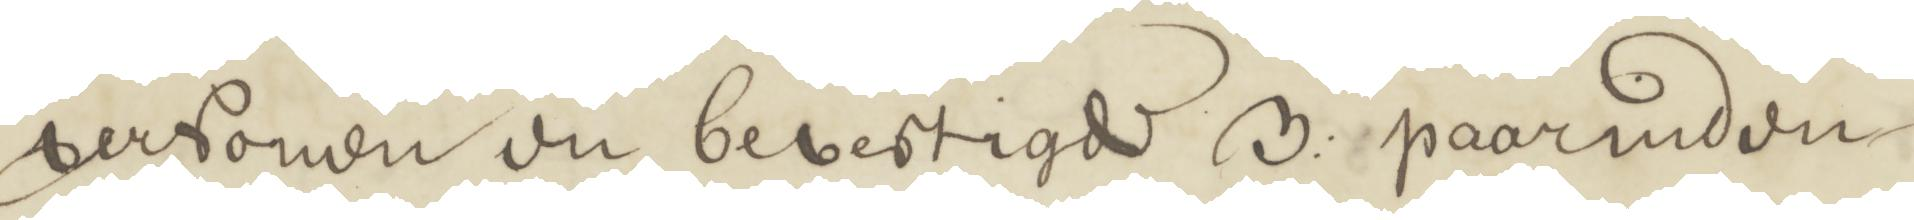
personen en bevestigde 3: paar inden
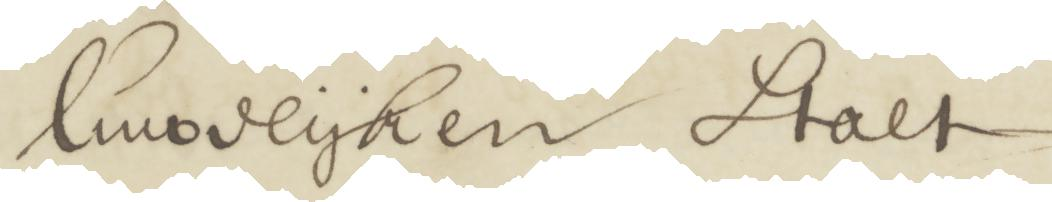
huwelijken Staet
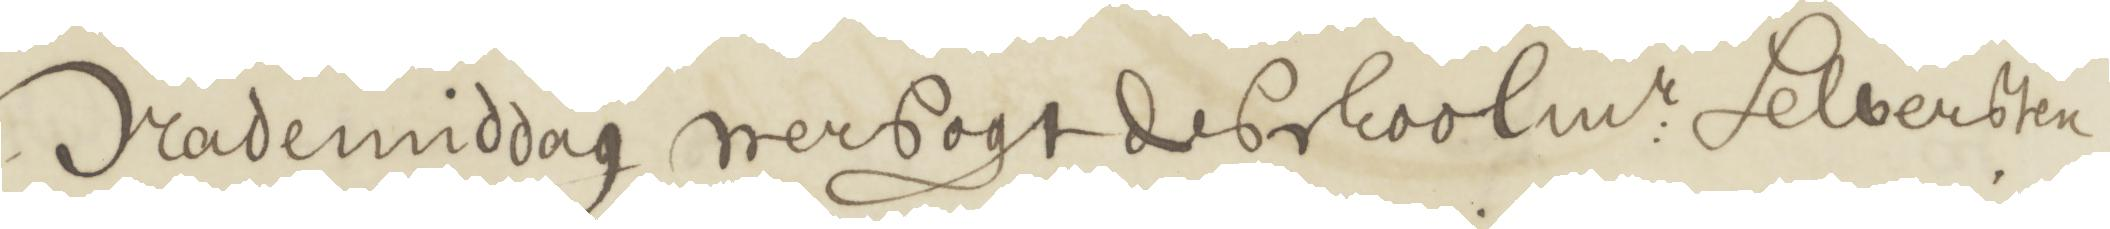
Nademiddag versogt de schoolm:r Selverster
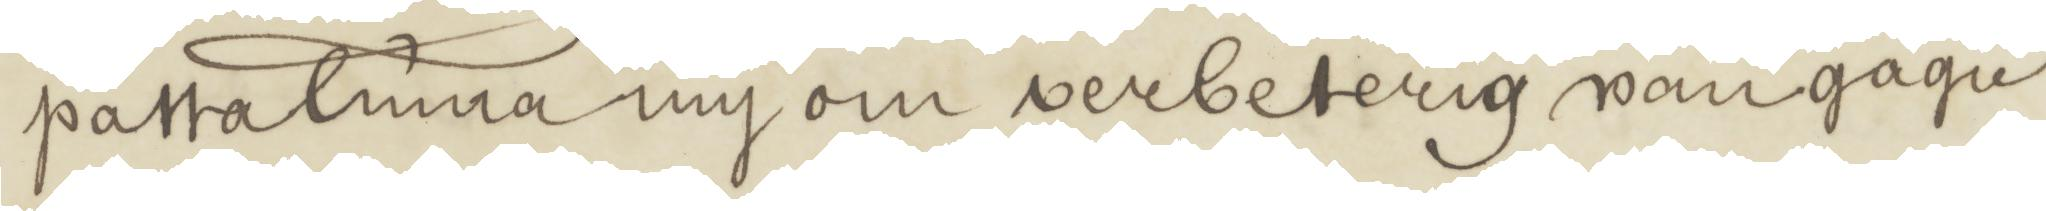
pattaluma mij om verbeterig van gagie
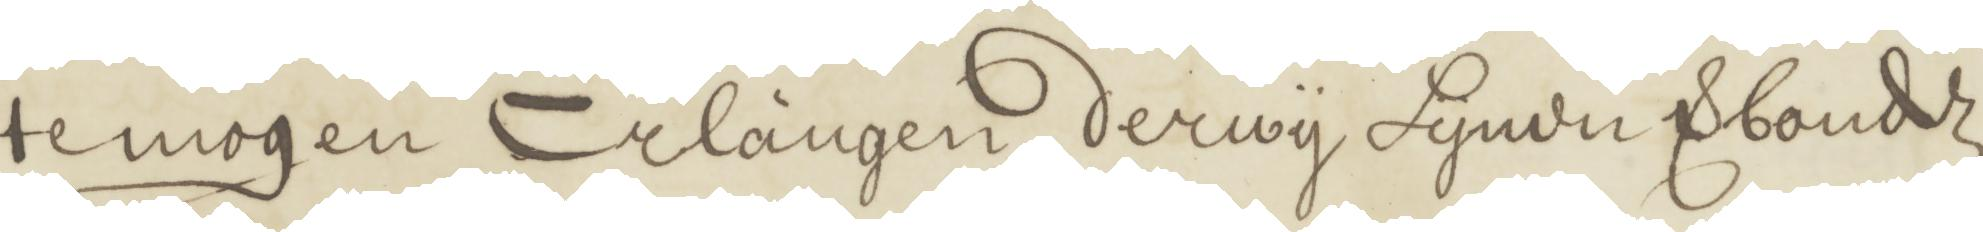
te mogen Erlangen derwij Sijnen verbonden
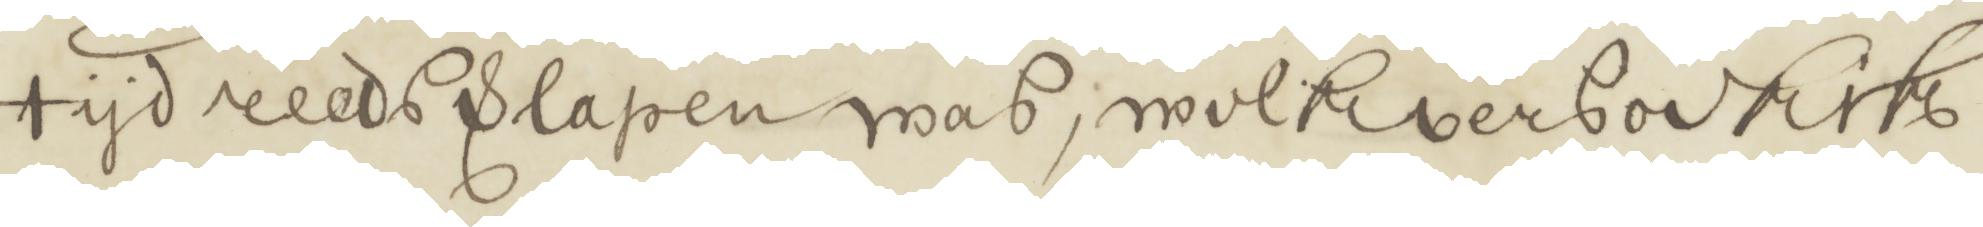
tijd reeds verlapen was; welk versoek ik
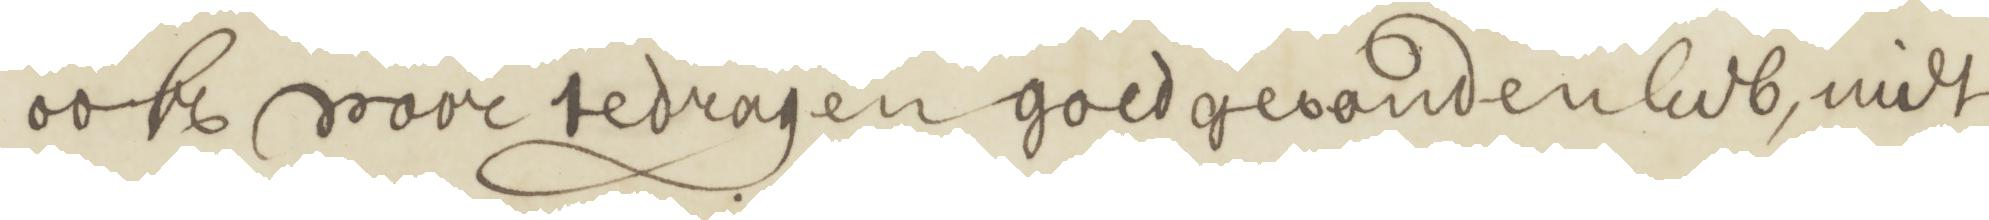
ook voor te dragen goed gevonden heb, niet
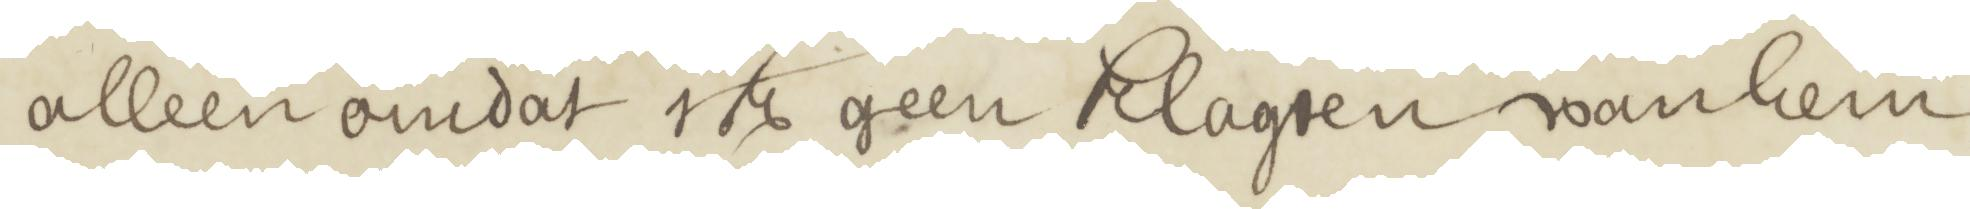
alleen om dat ik geen klagten van hem
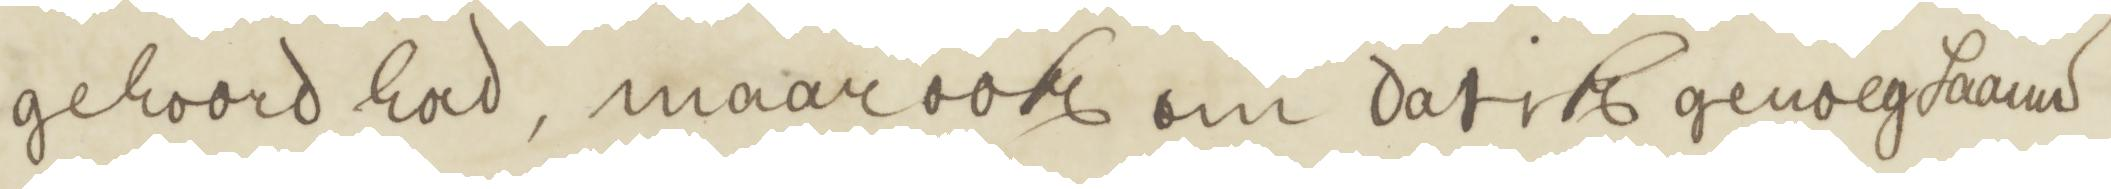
gehoord had, maar ook om dat ik genoegsaame
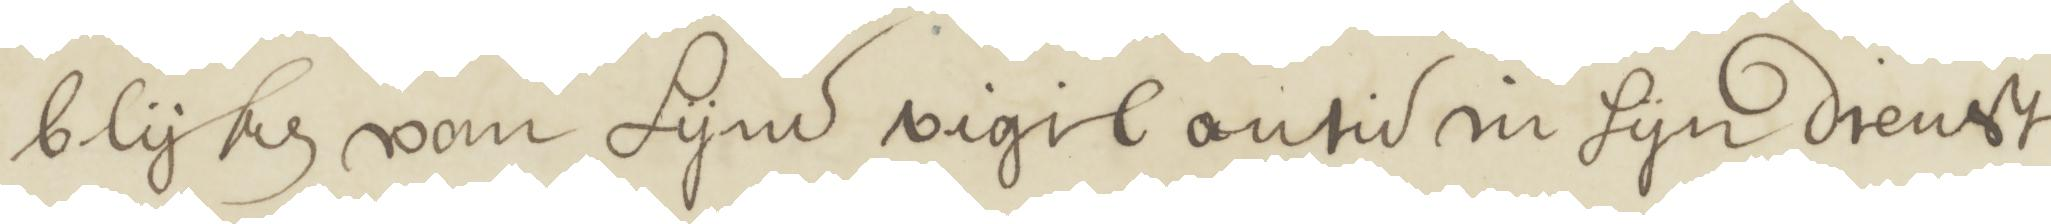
blijken van Sijne vigilantie in Sijn dienst
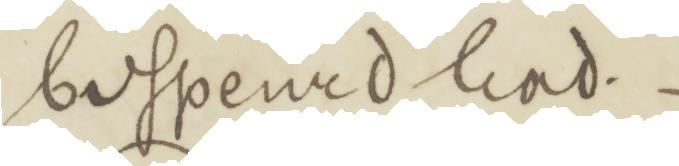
bespeurd had.
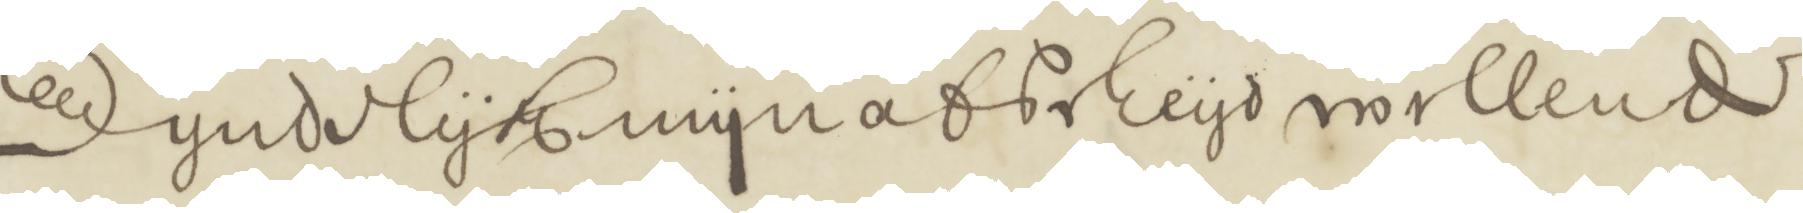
Eijndelijk mijn afscheijd willende
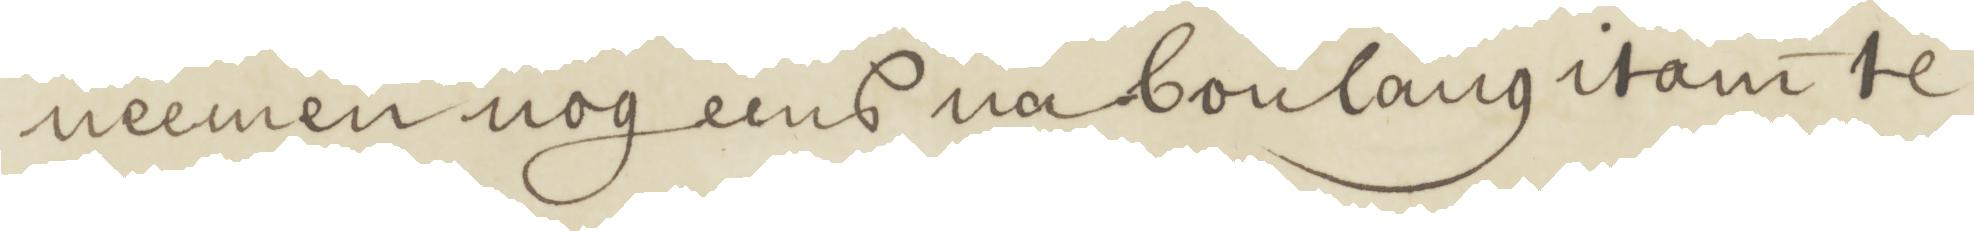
neemen nog eens na boulang itam te
